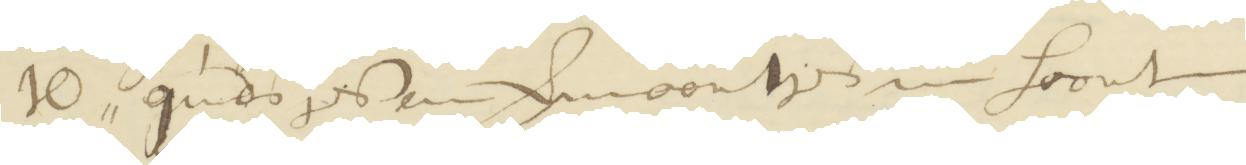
10 „ gudsjes en vermoortjes in soort
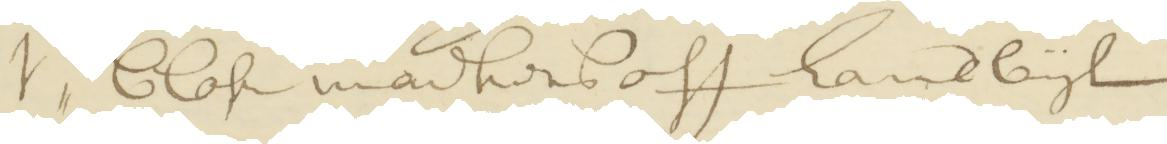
1 „ blokmaekers oft handbijl
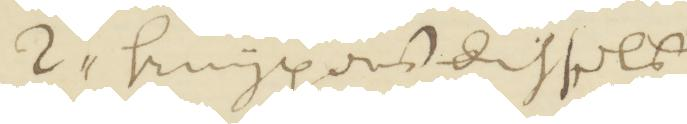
2 „ kuijpers dissels
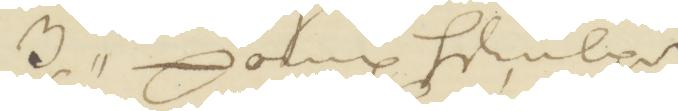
3 „ pomp schulpen
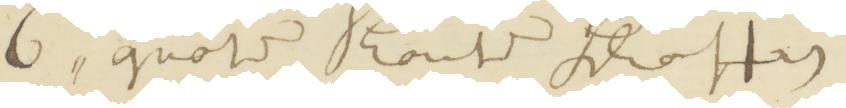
6 „ grote houte schotten
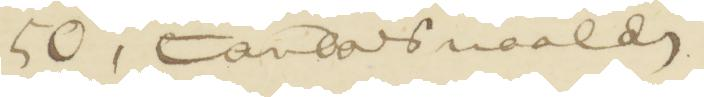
50 „ cardoes naalden
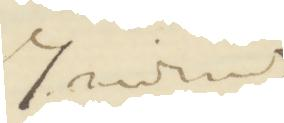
7 riemen
